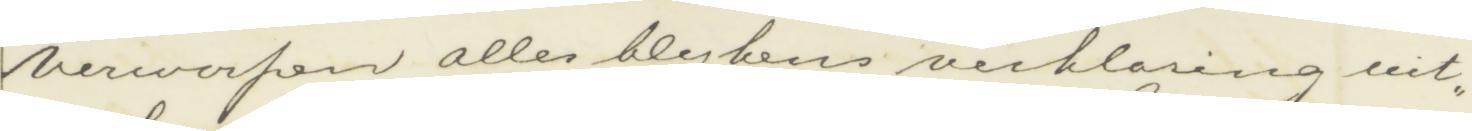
verworpen alles blykens verklaring uit„
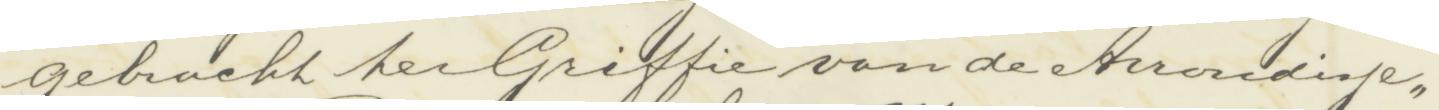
gebracht ter Griffie van de Arrondisse„
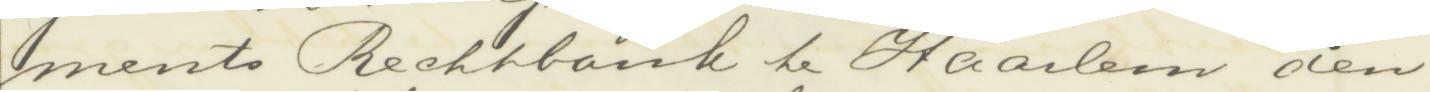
ments Rechtbank te Haarlem den
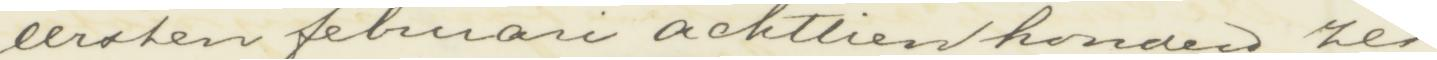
eersten februari achttien honderd zes
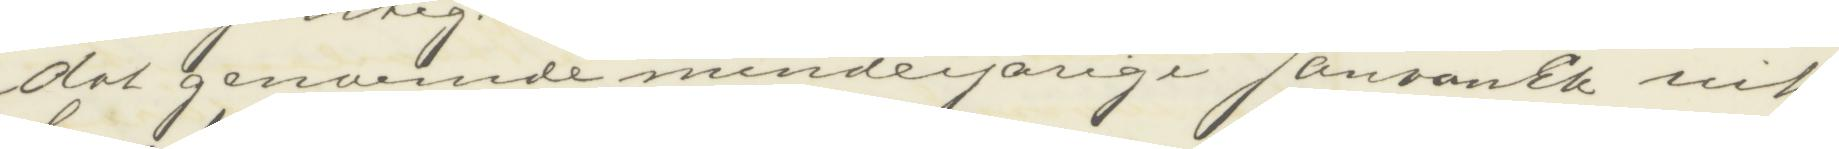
dat genoemde minderjarige Jan van Ek uit
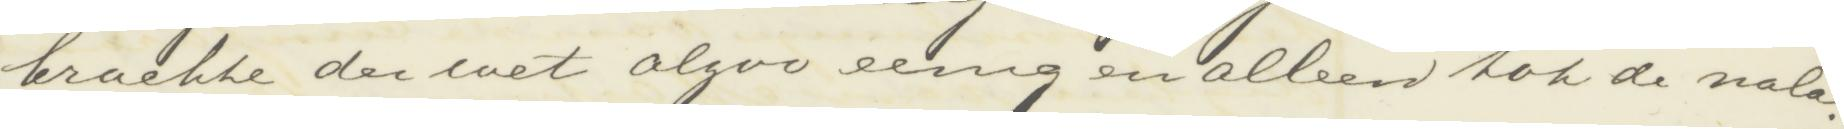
krachte der wet alzoo eenig en alleen tot de nala.
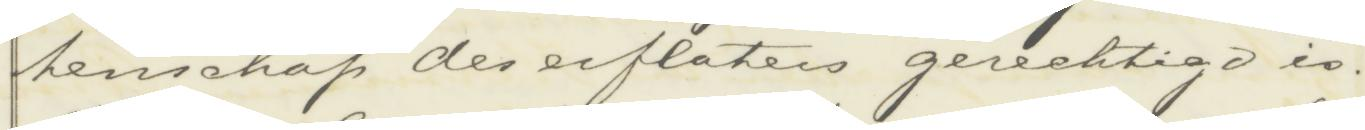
tenschap des erflaters gerechtigd is.
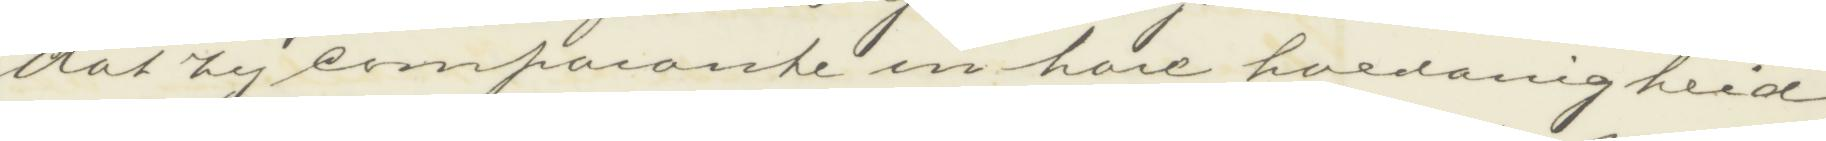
dat zy comparante in hare hoedanigheid
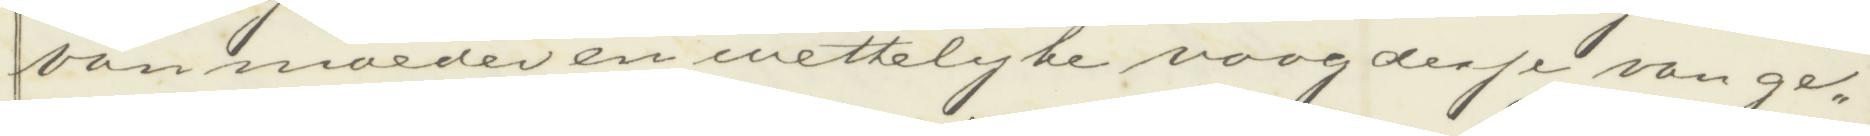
van moeder en wettelyke voogdesse van ge„
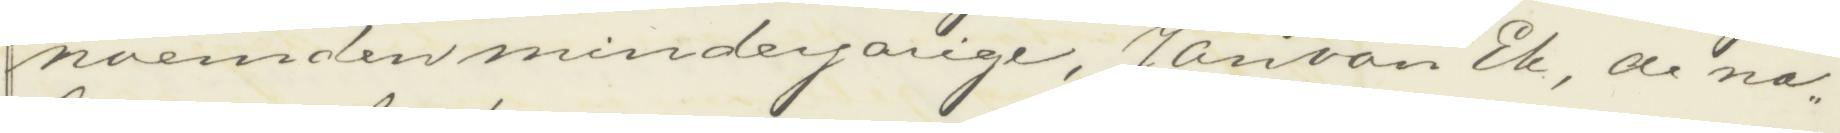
noemden minderjarige, Jan van Ek, de na„
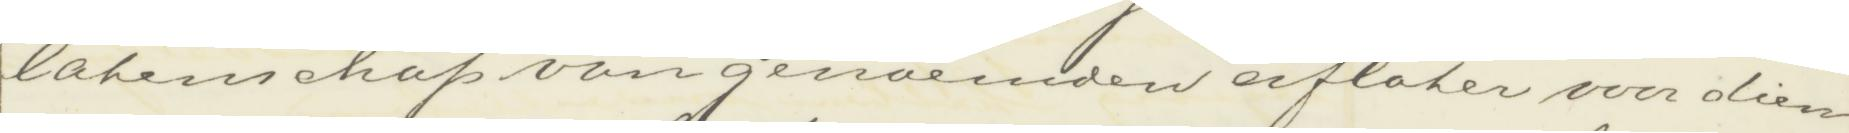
latenschap van genoemden erflater voor dien
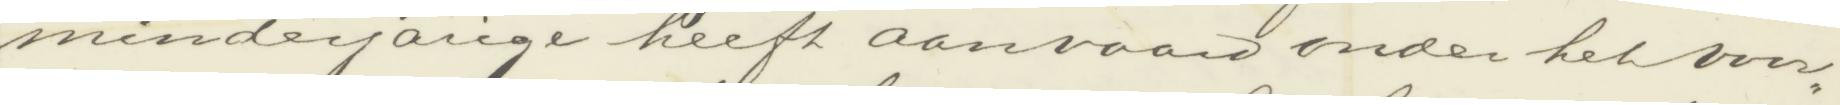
minderjarige heeft aanvaard onder het voor„
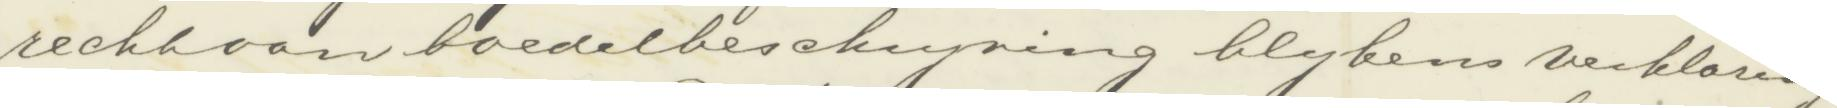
recht van boedelbeschryving blykens verklaring
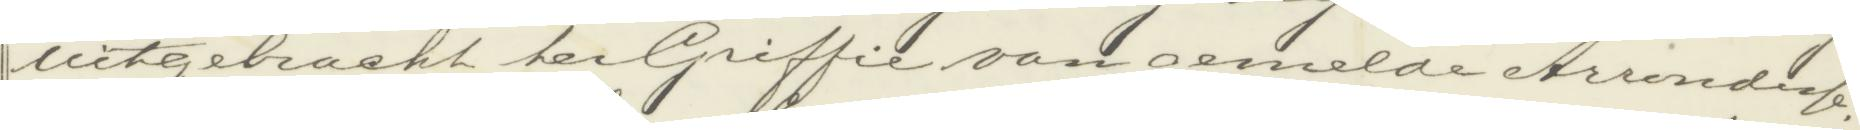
uitgebracht ter Griffie van gemelde Arrondesse,
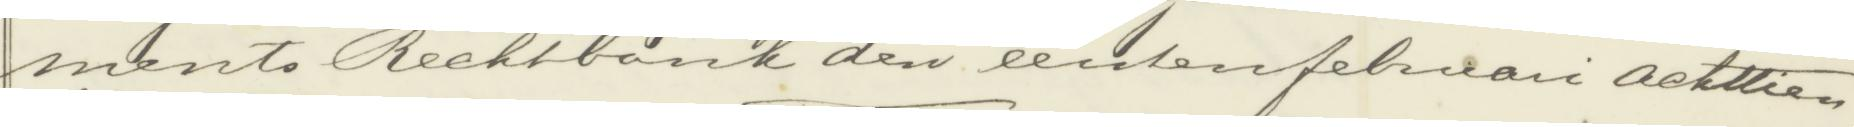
ments Rechtbank den eersten februari achttien
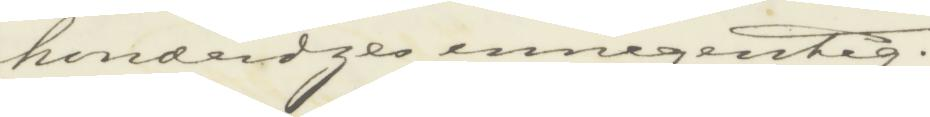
honderd zes ennegentig.
